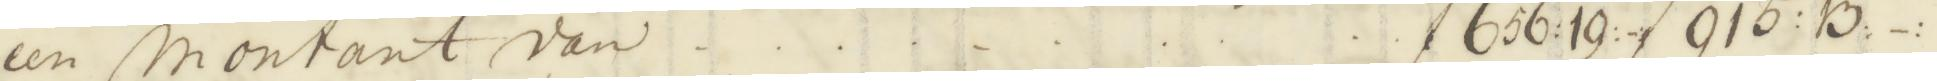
een montant van . . . . . . . . . . . ƒ 656: 19: —: ƒ 915: 13: —:
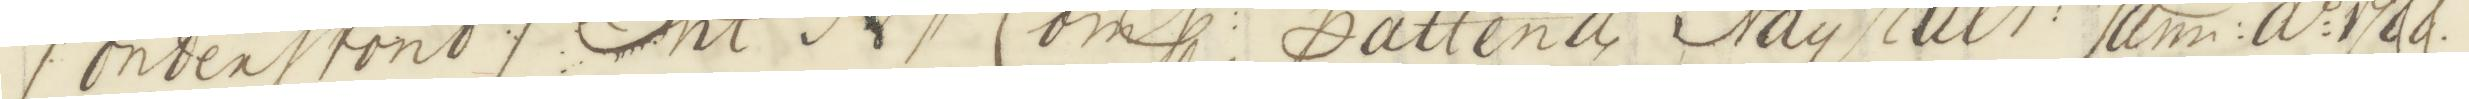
/:onderstond:/ In't N„ds Comp:r pattena Adij ult:o Janu: a:o 1744.
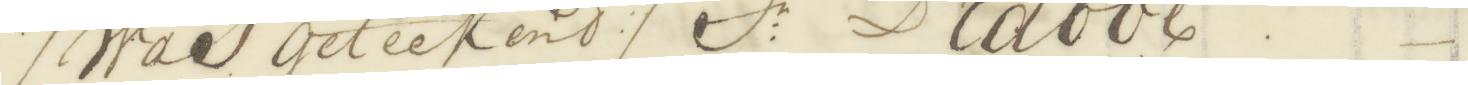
/was geteekend:/ J:r Drabbe. —
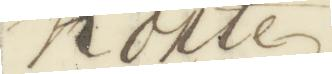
korte
